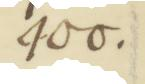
400.
